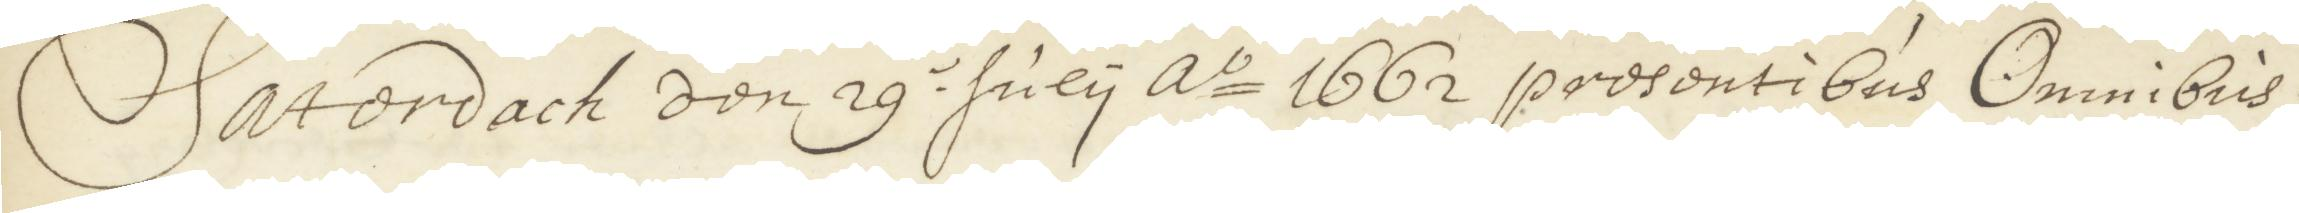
Saterdach den 29.' Julij a=o 1662 presentibus Omnibus
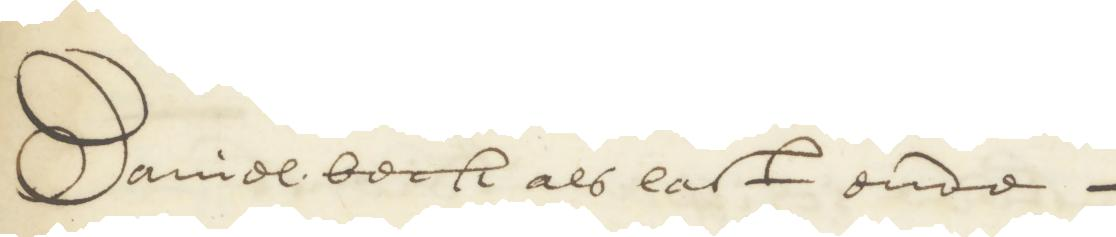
Daniel beck als last ende
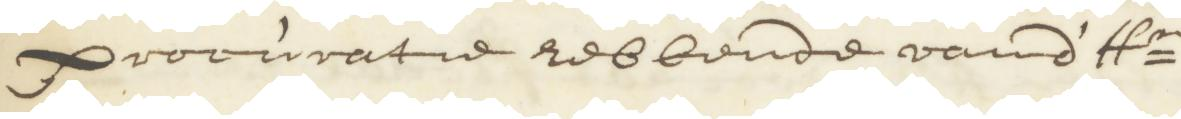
procuratie hebbende van d’ H=r
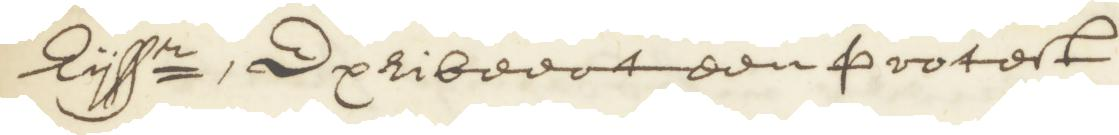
Eijss=r, Exhibeert den protest
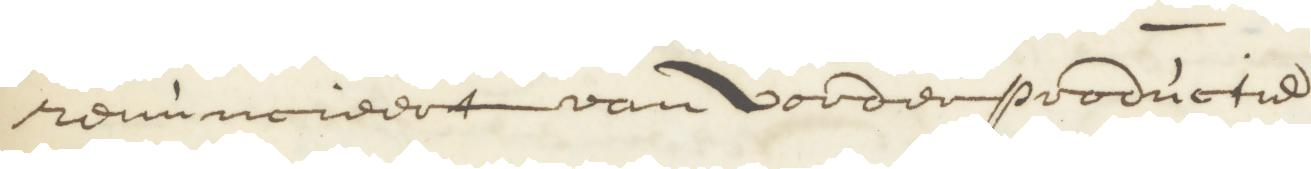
renuncieert van verder productie
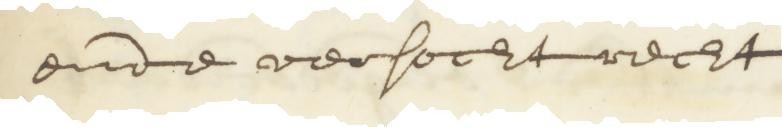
ende versocht recht
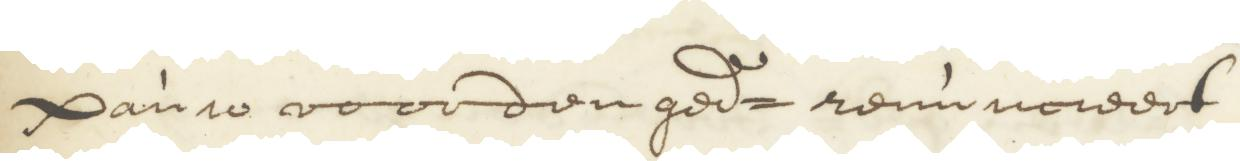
Pauw voor den ged=e renuncieert
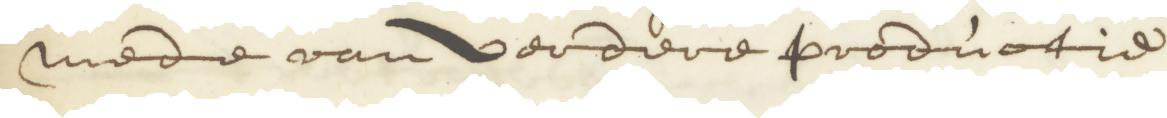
mede van verdere productie
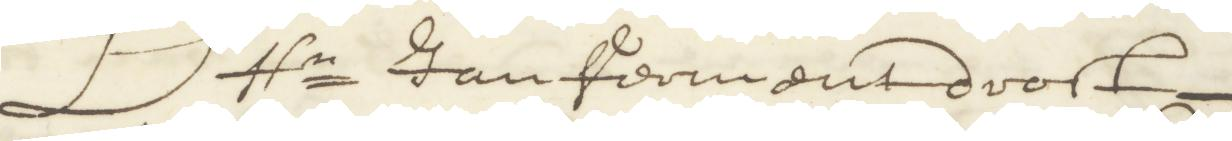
D' H=r Jan ferment drost—
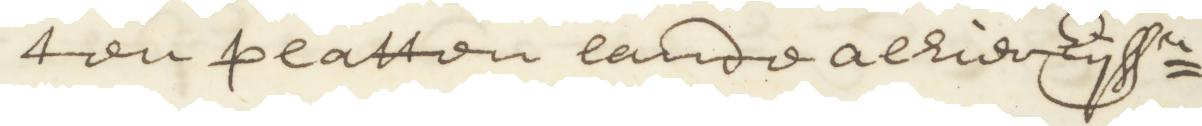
ten platten lande alhier Eijss=r
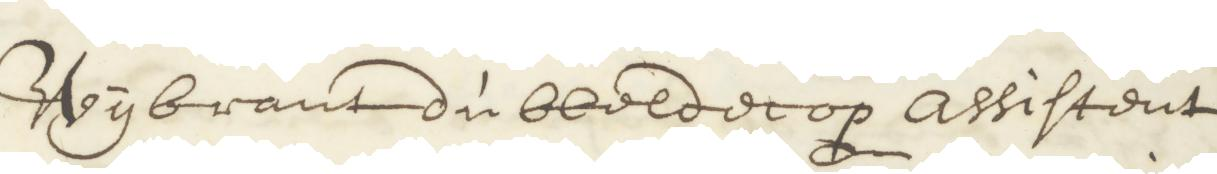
Wijbrant du weldecop assistent
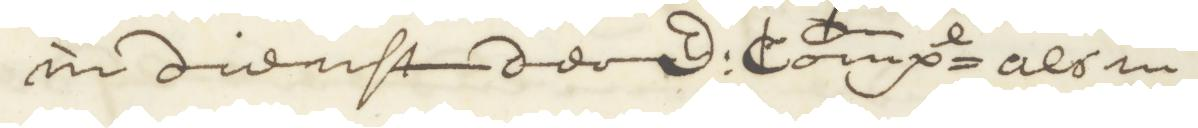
in dienst der E: Comp=e als in
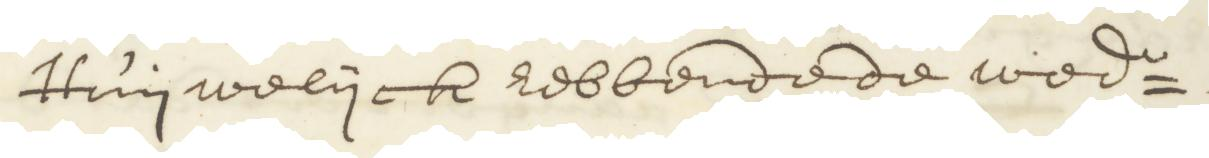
Huijwelijck hebbende de wed=e
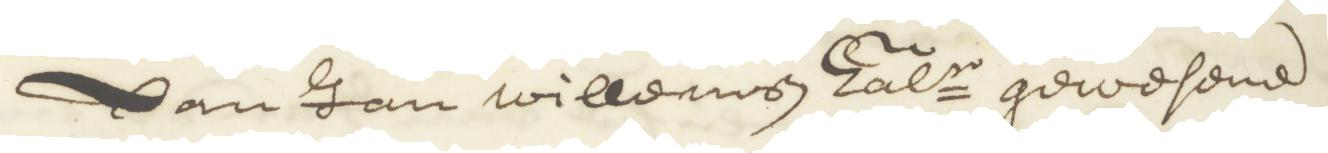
van Ian willems Zal=r gewesene
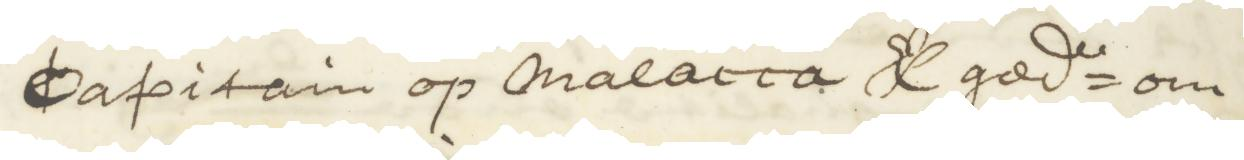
Capitain op malacca & ged=e om
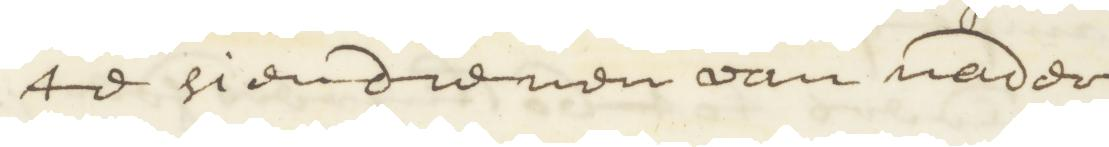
te sien dienen van nader
